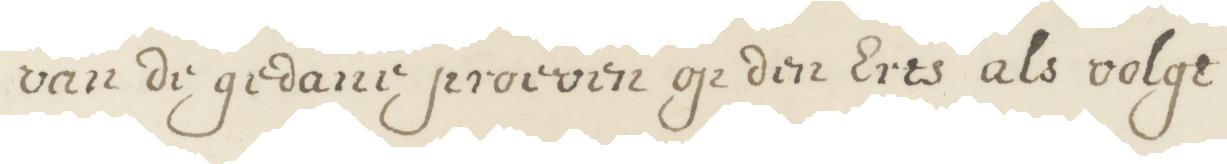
van de gedane proeven op den Erts als volgt
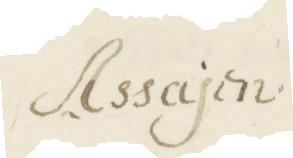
Assajen
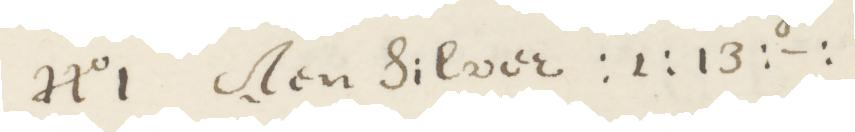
No 1 Aen silver : 1 : 13 : — :
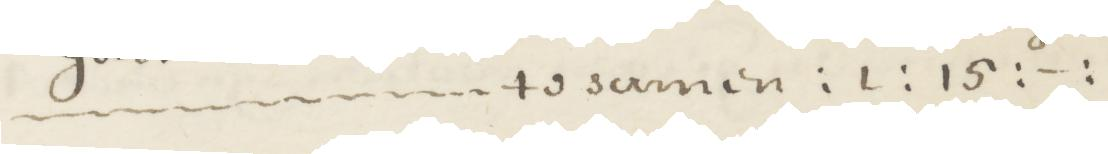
te samen : 1 : 15 : — :
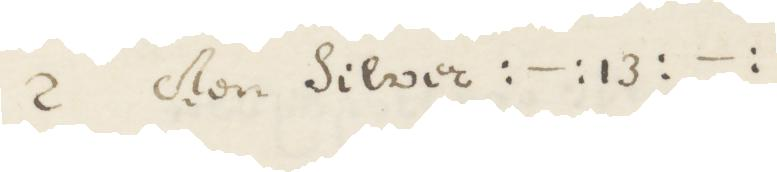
2 Aen silver : — : 13 : — :
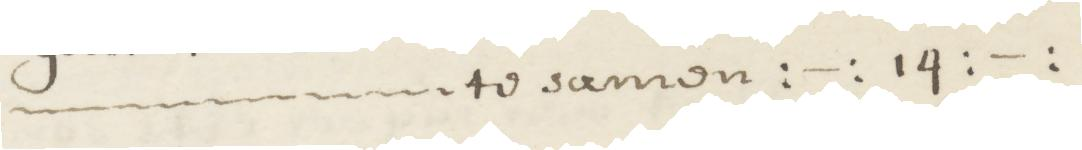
te samen : — : 14 : — :
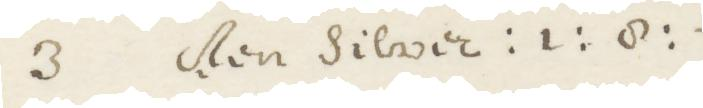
3 Aen silver : 1 : 8 :
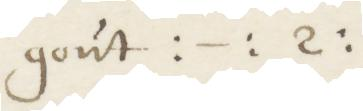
gout : — : 2 :
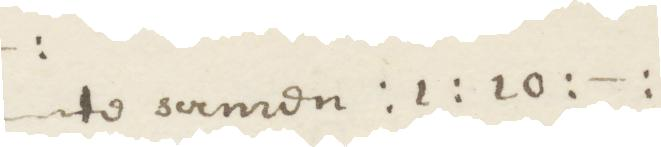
te samen : 1 : 10 : —
